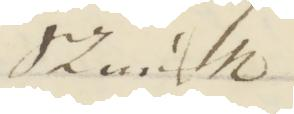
V Zurk
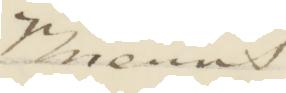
V Meurs
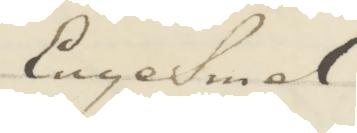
Engelsmet
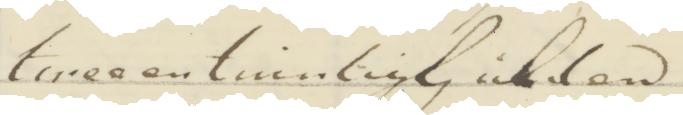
tweeentwintig Gulden
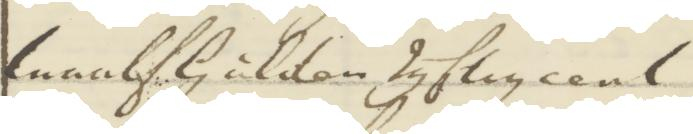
twaalf Gulden vijftig cent
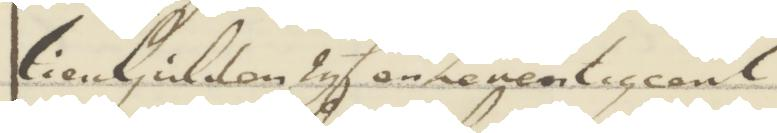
tien Gulden vyfenzeventig cent
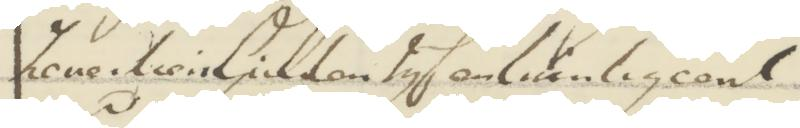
zeventien Gulden vyfentwintig cent
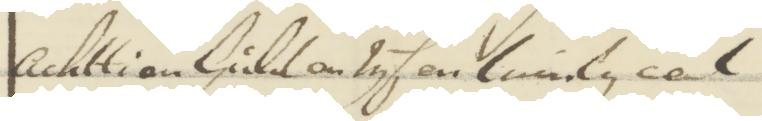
achttien Gulden vyfentwintig cent
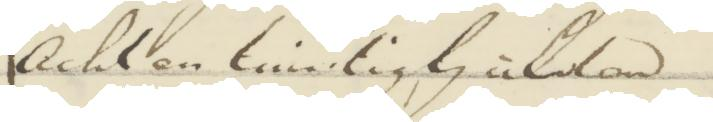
Achtentwintig Gulden
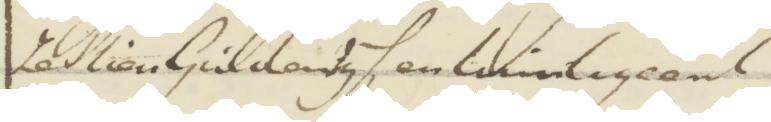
zestien Gulden vyfentwintig cent
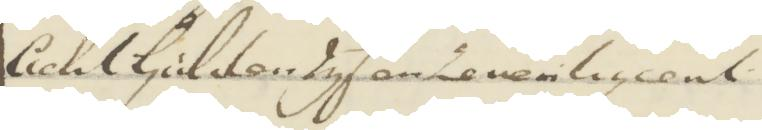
Acht Gulden Vyfenzeventig cent
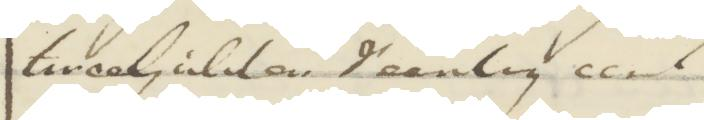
twee Gulden veertig cent
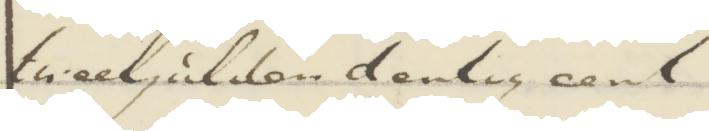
twee Gulden dertig cent
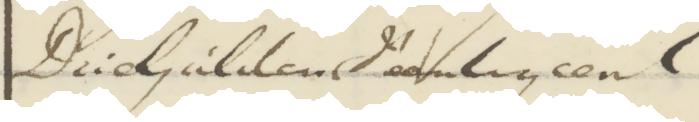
Drie Gulden Veertig cent
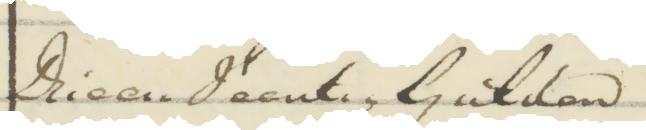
Drieenveertig Gulden
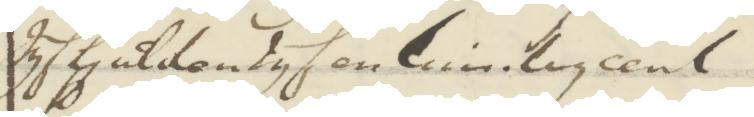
Vyf Gulden Vyfentwintig cent
